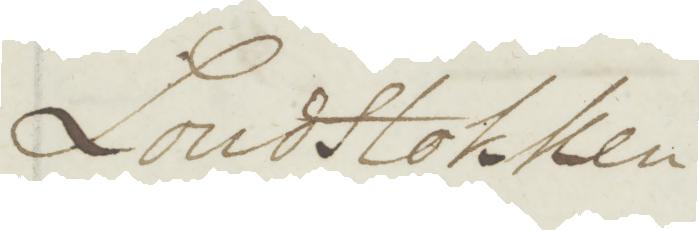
Londstokken
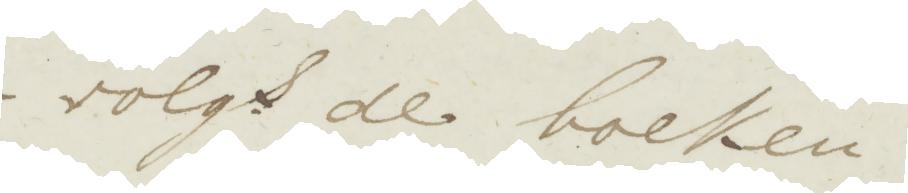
volg:s de boeken
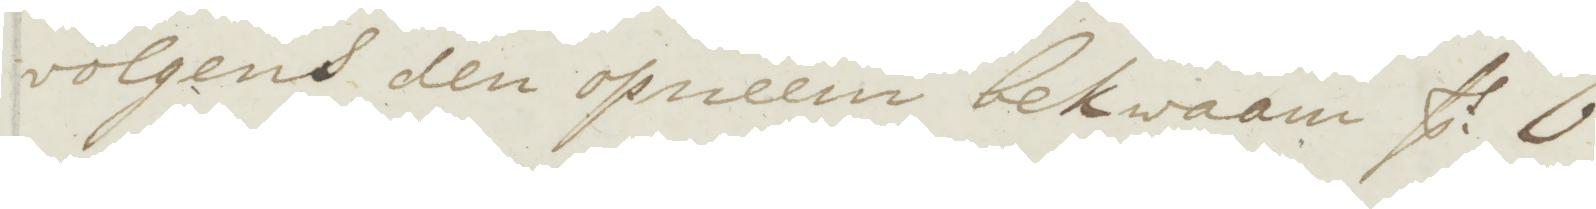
volgens den opneem bekwaam p:s O
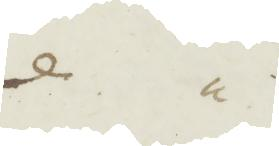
_.o. „
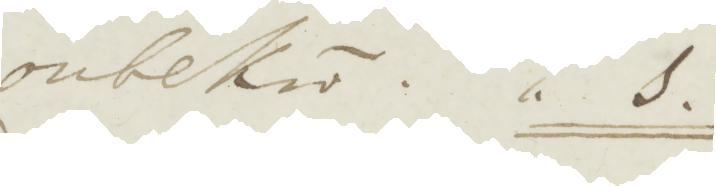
onbekw . „ 8.
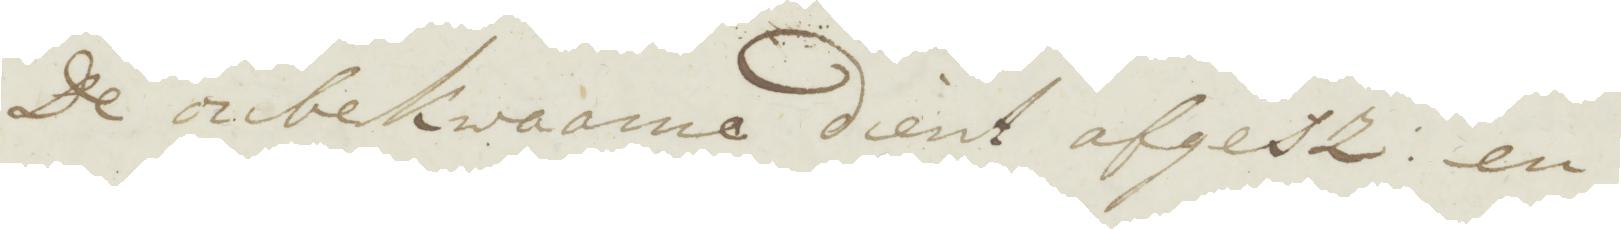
De onbekwaame dient afgesz: en
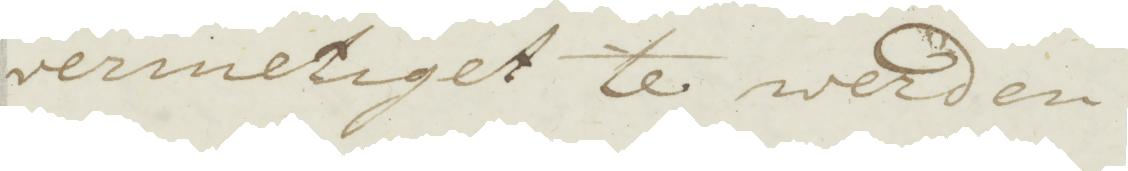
vernietiget te werden
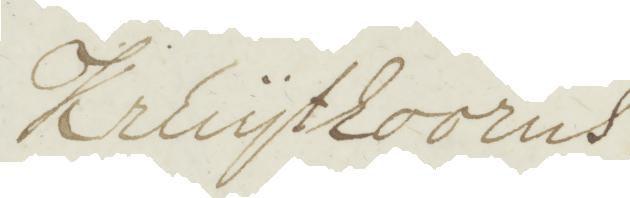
Kruijthoorns
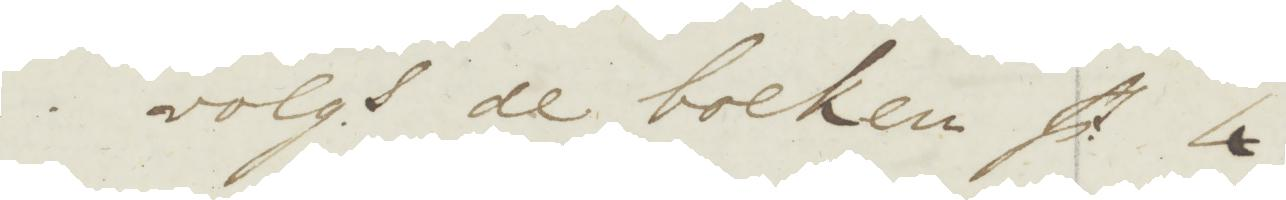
.volg.s de boeken p=s 4
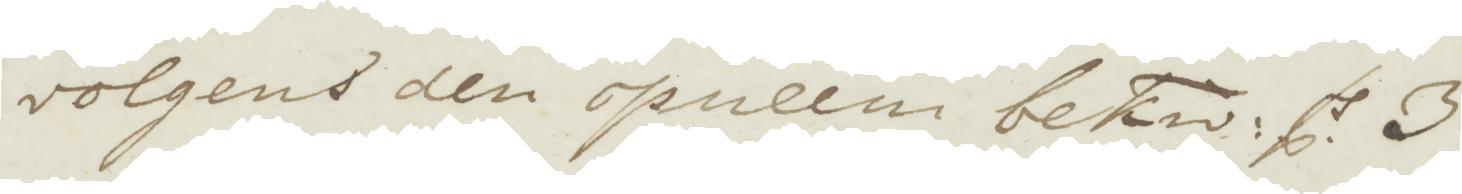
volgens den opneem bekw: ps 3
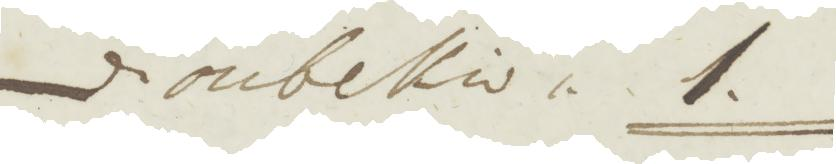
_o onbekw „ 1.
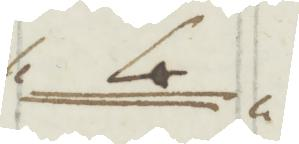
„ 4
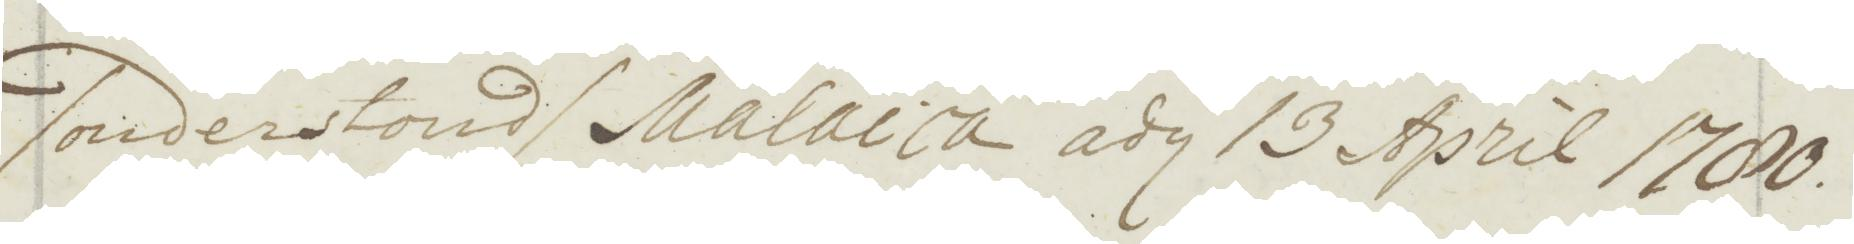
/onderstond/ Malacca ady 13 April 1780.
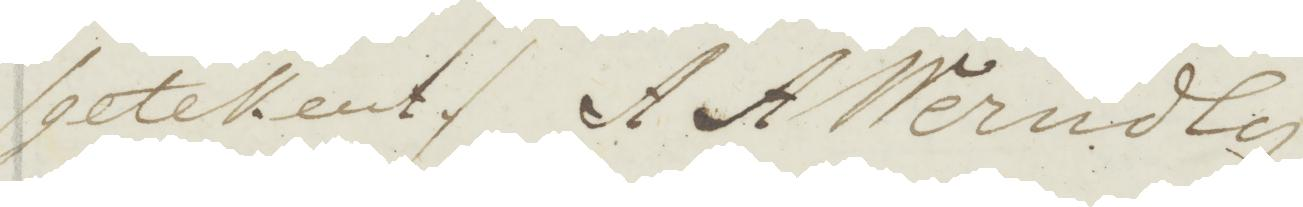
/getekent:/ A A Werndly
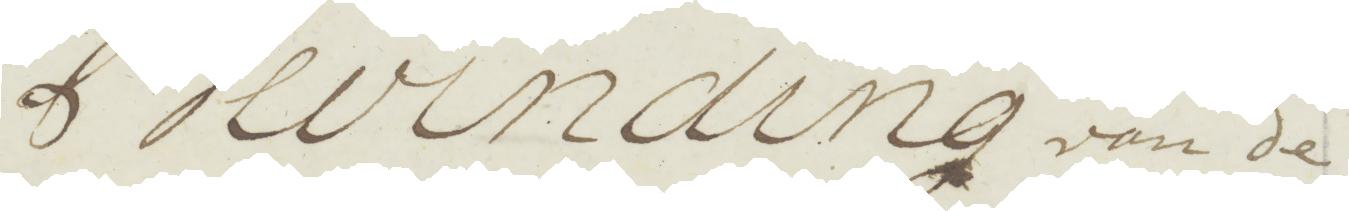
Bevinding van de
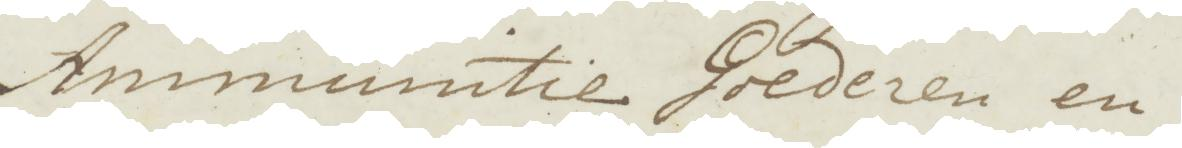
Ammunitie Goederen en
